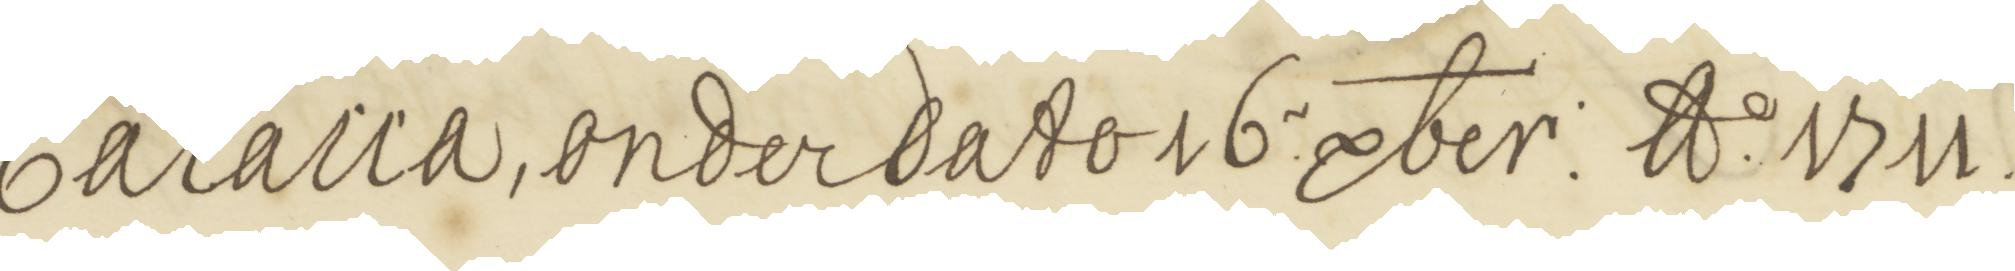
Malacca, onder dato 16.' xber: A.o 1711
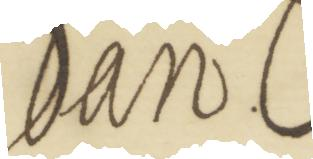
Van.
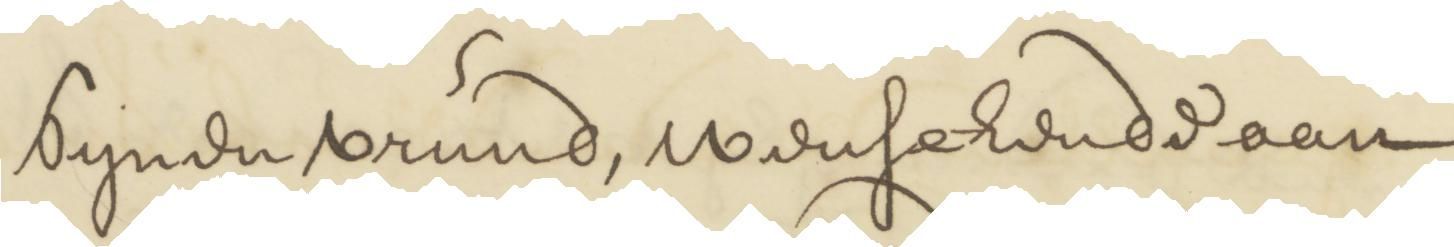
sijnen vrund, wenschende aan
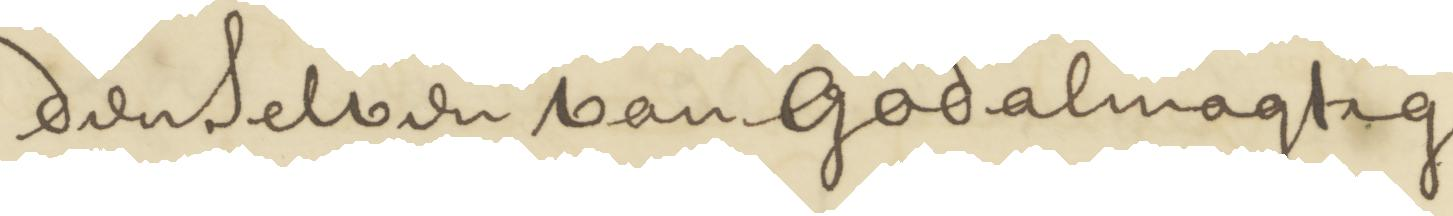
denselven van god almagtig
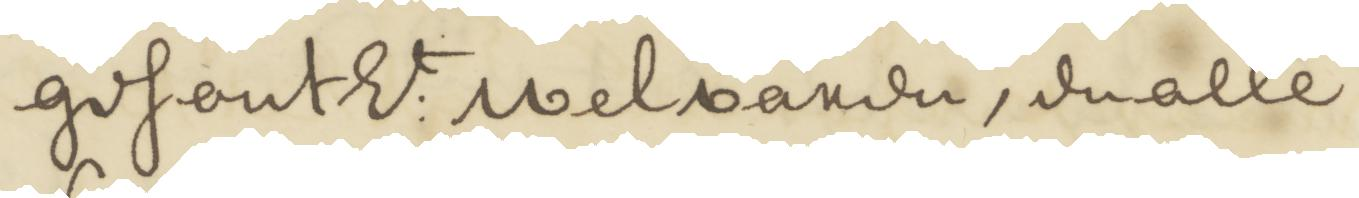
gesonth:t welvaren, en alle
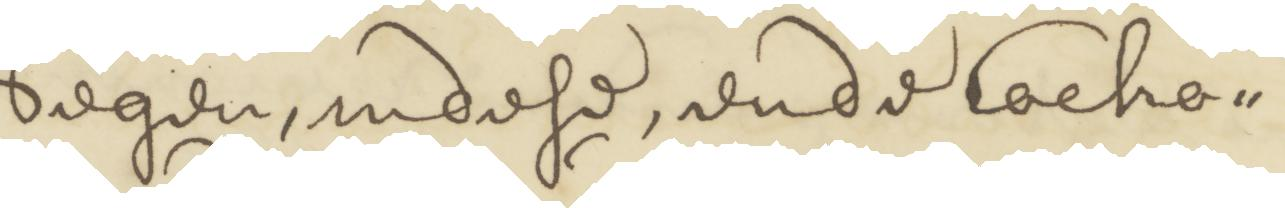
segen, indese, ende toeko„
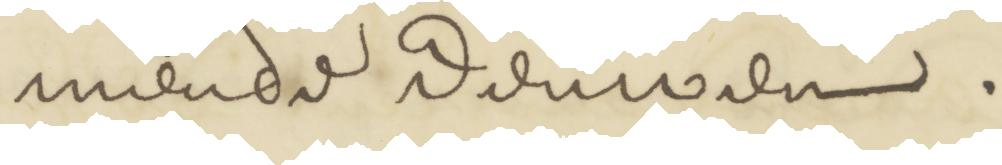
mende Eeuwen
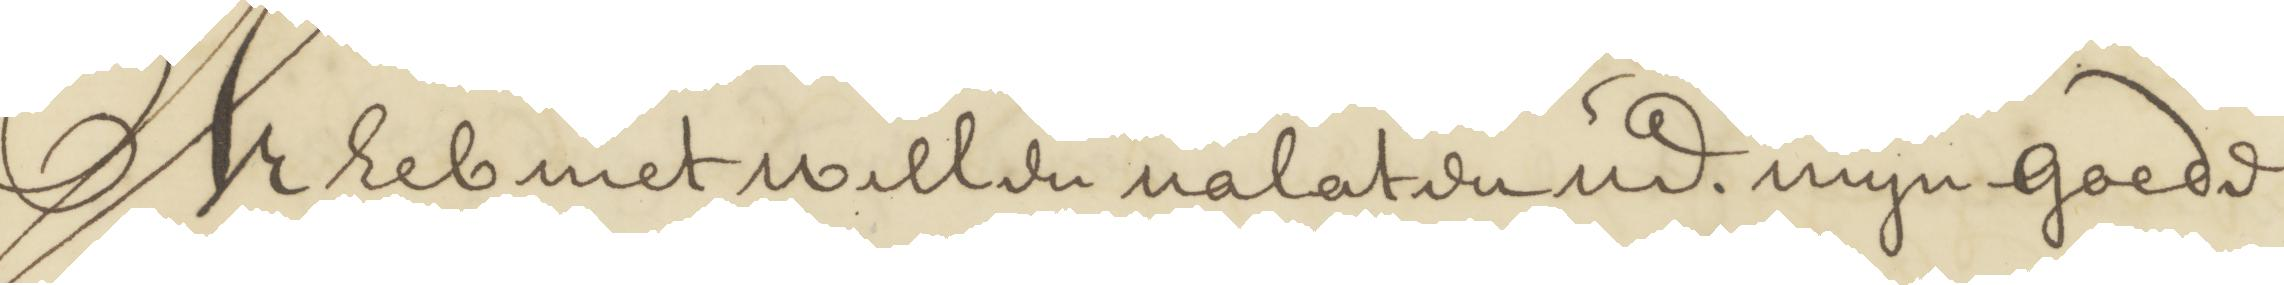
Jk heb niet willen nalaten uE. mijn goede
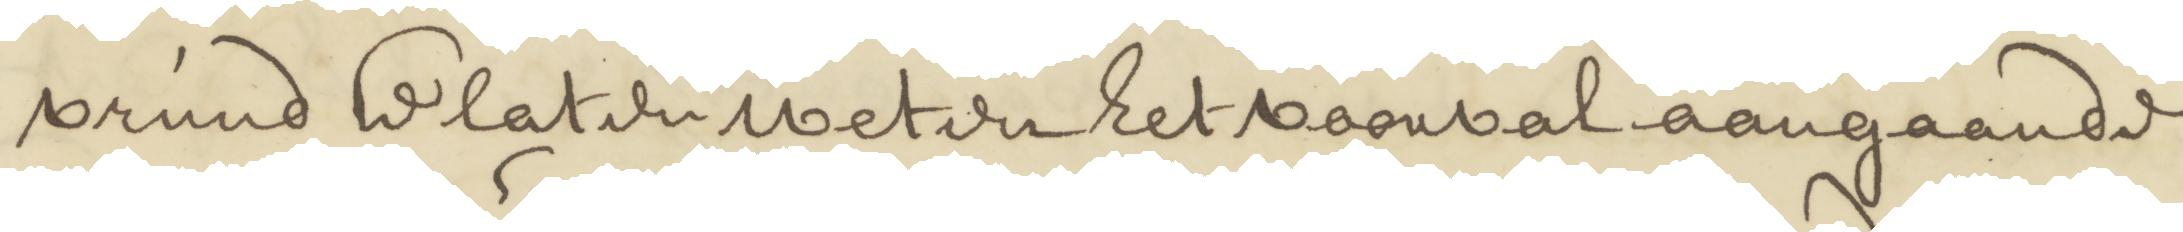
vrund te laten weten het voorval aangaande
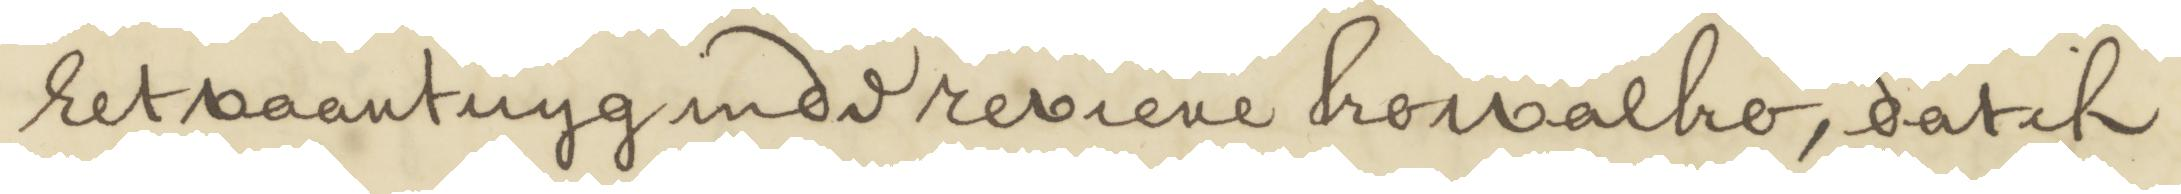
het vaartuijg inde reviere kowalko, dat ik
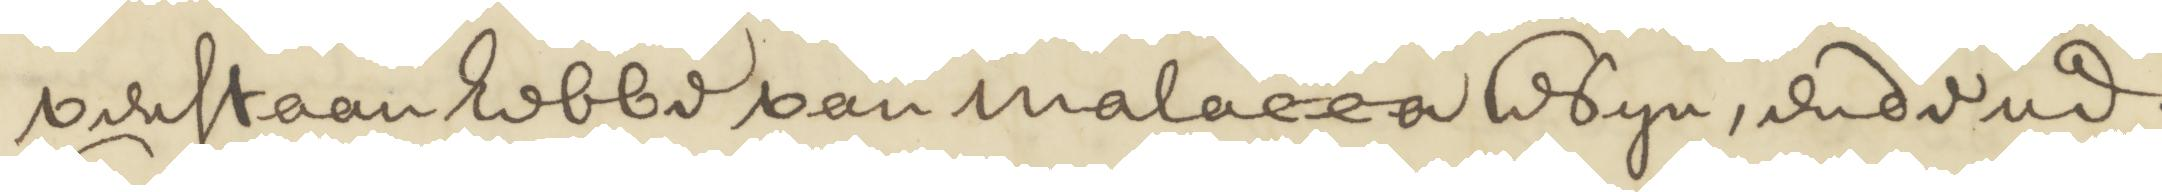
verstaan hebbe van malacca te sijn, ende uE
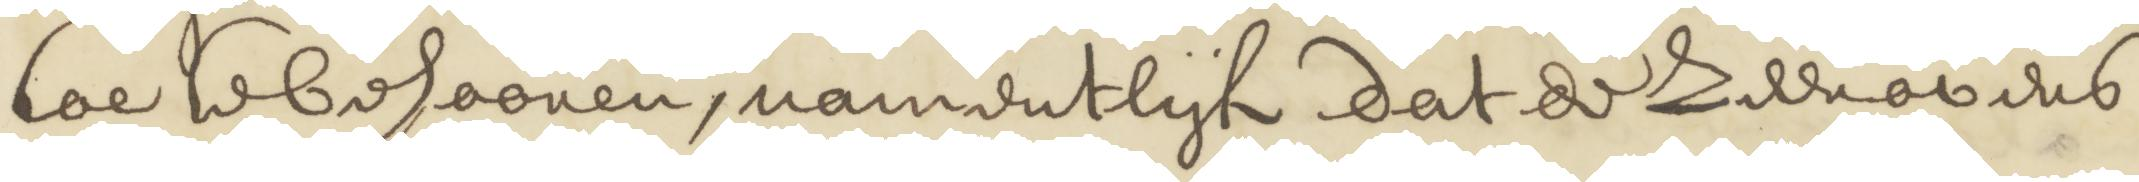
toe te behooren, namentlijk dat de zeerovers
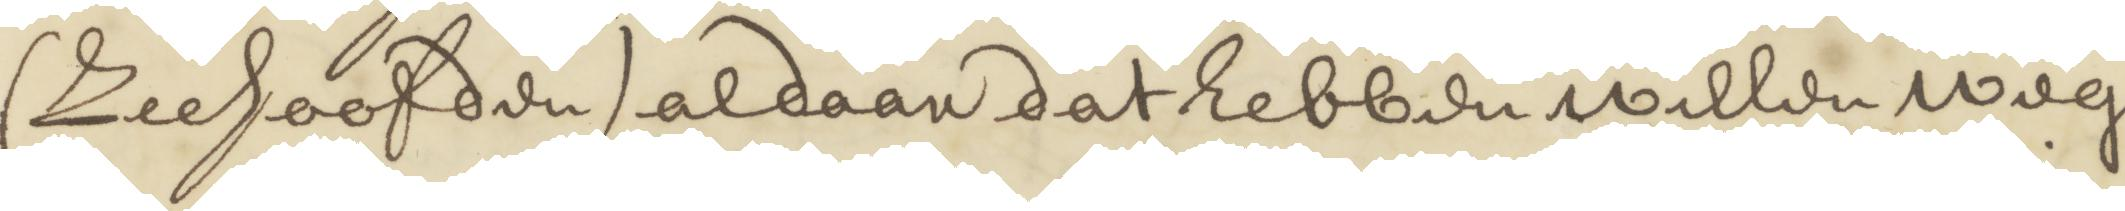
zeehoofden) aldaar dat hebben willen weg
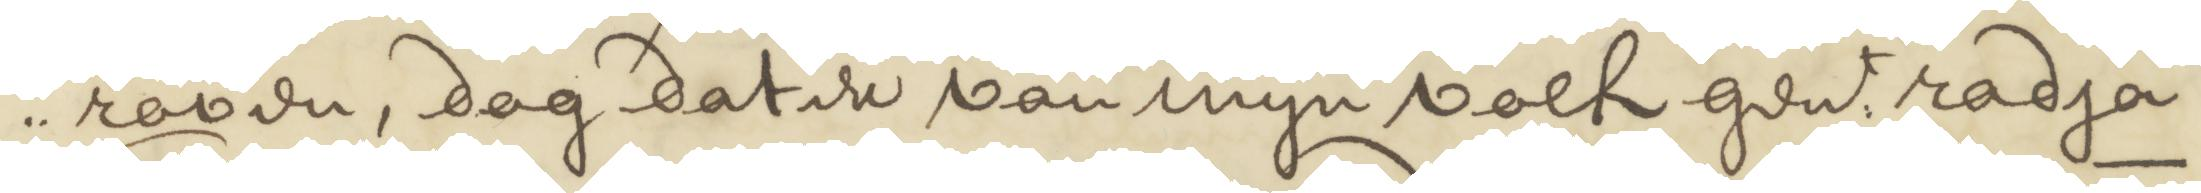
„roven, dog dat er van mijn volk gen:t radja
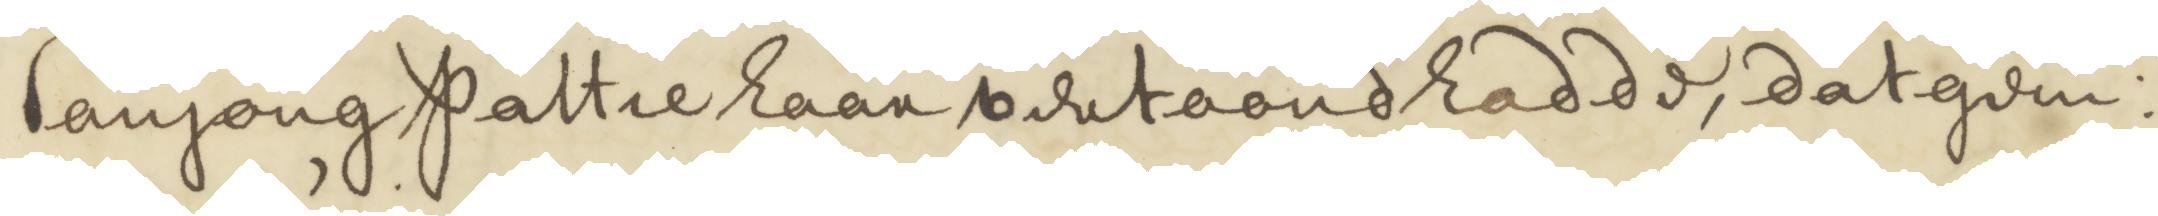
tanjong pattie haar vertoond hadde, dat gem
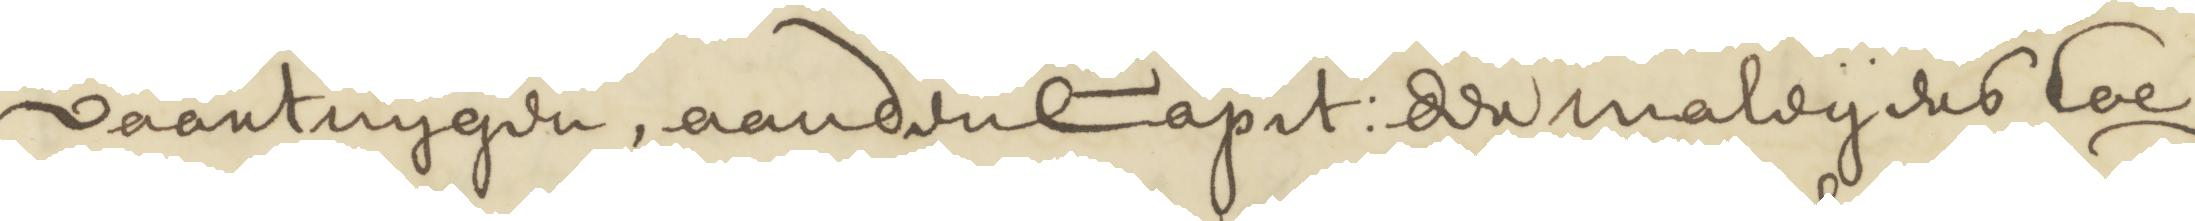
vaartuijgen, aan den Capit: der maleijers toe
